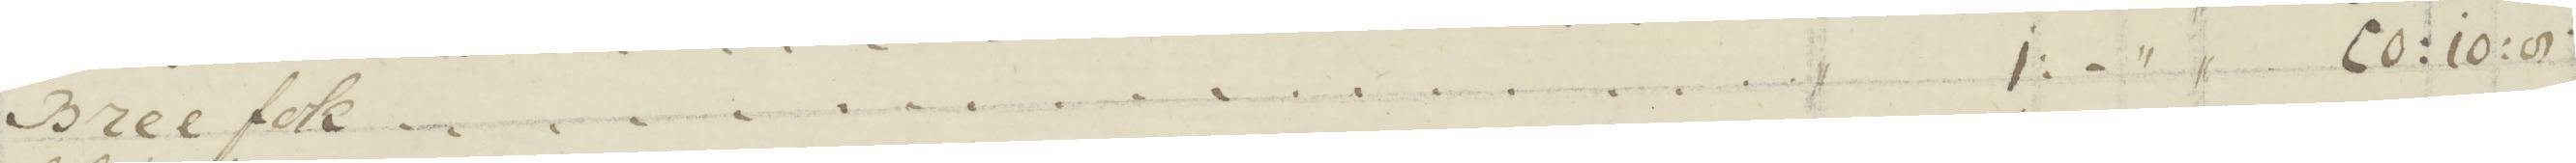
Bree fok - - - - - - - - - - - - - - - - - - - „ 1„ -„ „ 50:10:8:
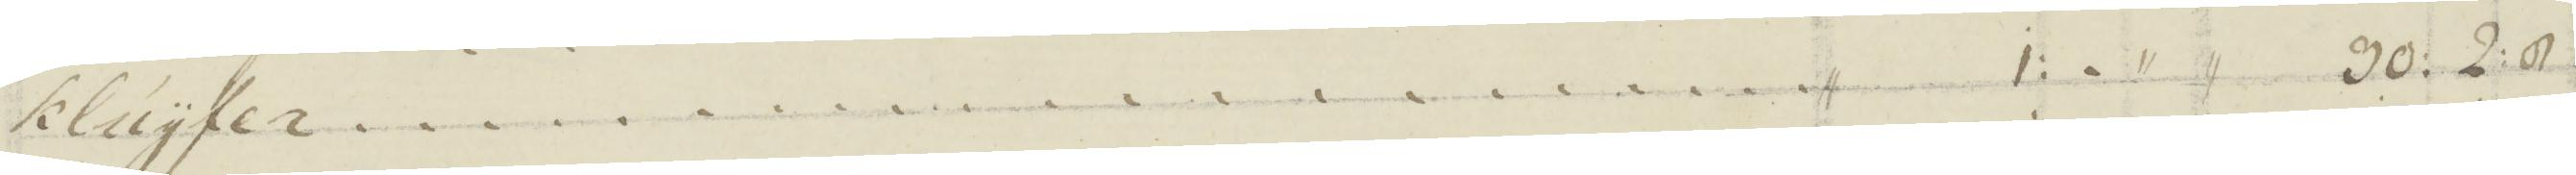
kluijfer - - - - - - - - - - - - - - - - - - - - - „ 1: - „ „ 30: 2:8
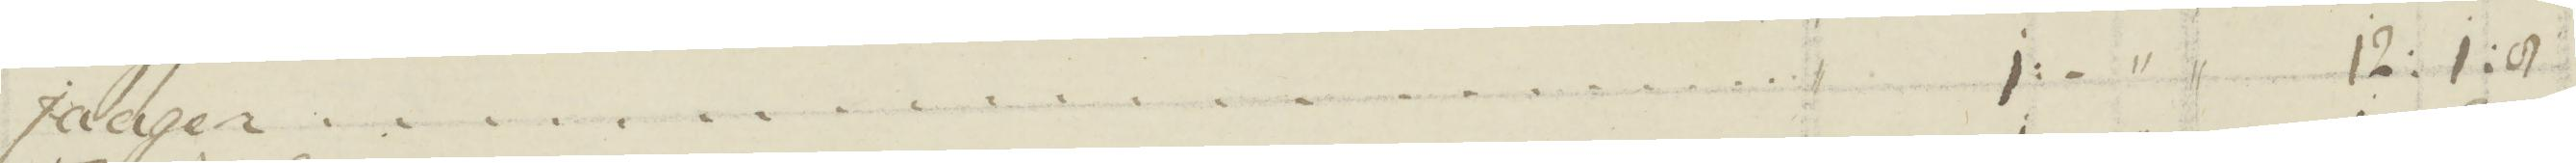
jaager - - - - - - - - - - - - - - - - - - - - - - „ 1: - „ „ 12: 1:8
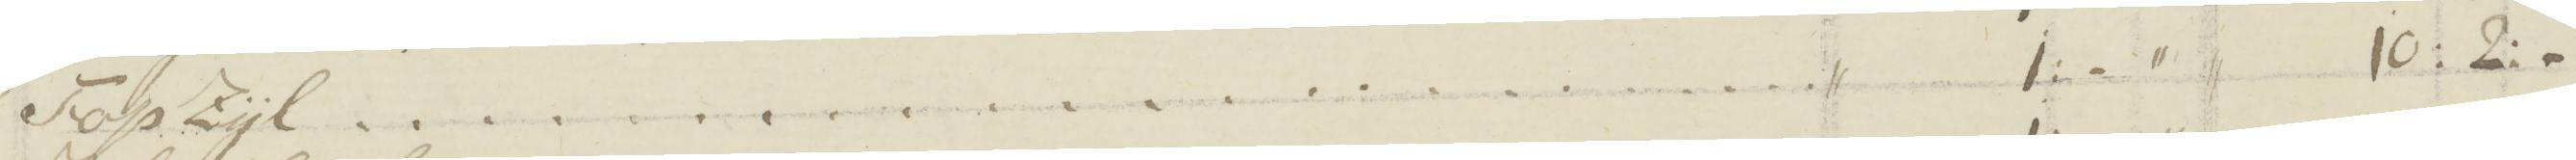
Top Zijl - - - - - - - - - - - - - - - - - - - - - - - „ 1: - „ „ 10: 2:—
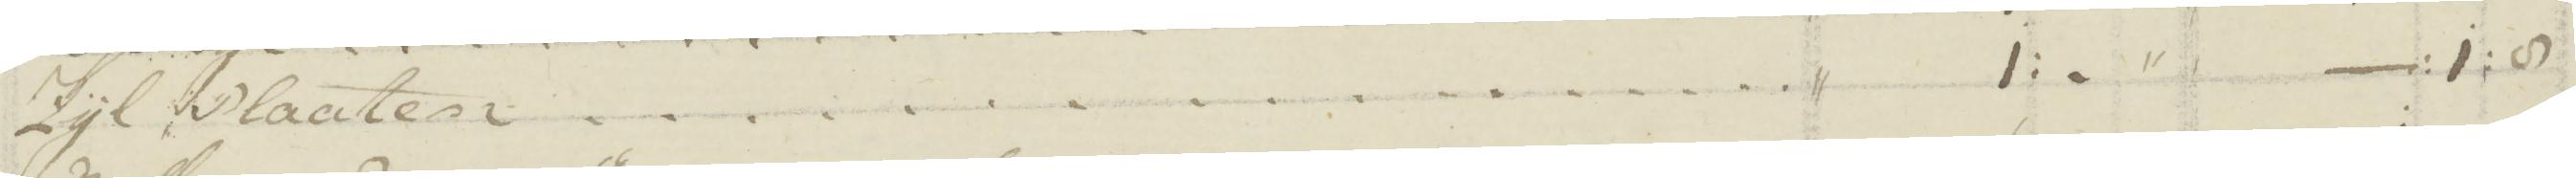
Zijl Plaaten - - - - - - - - - - - - - - - - - „ 1: - „ „ —: 1: 8
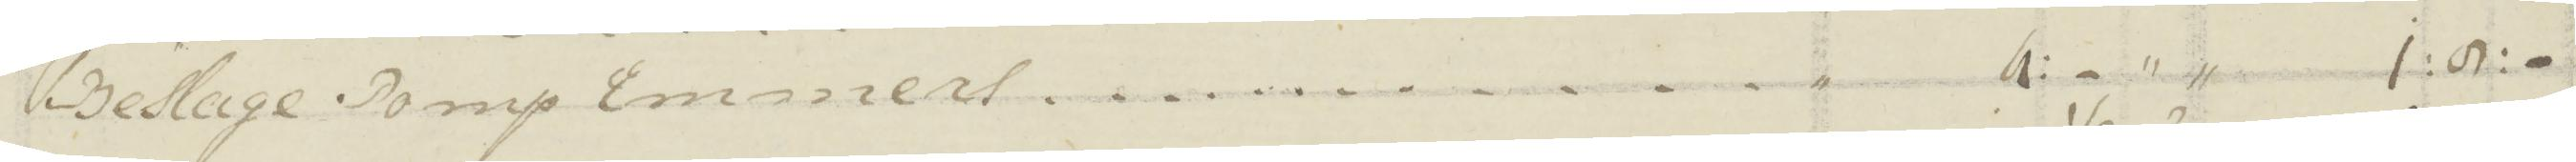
Beslage Pomp Emmers - - - - - - - - - - - - „ 4: - „ „ 1: 8: -
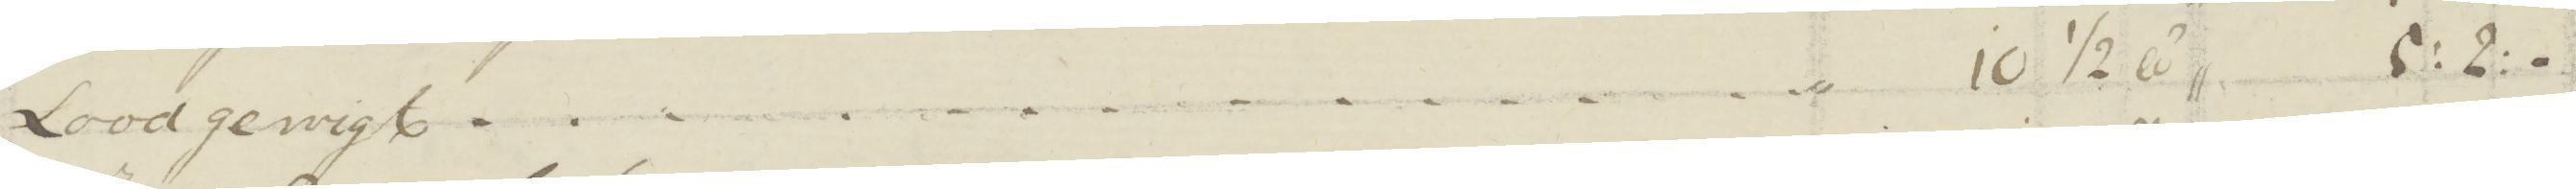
Lood gewigt - - - - - - - - - - - - - - - „ 10½ lb„ 5: 2: -
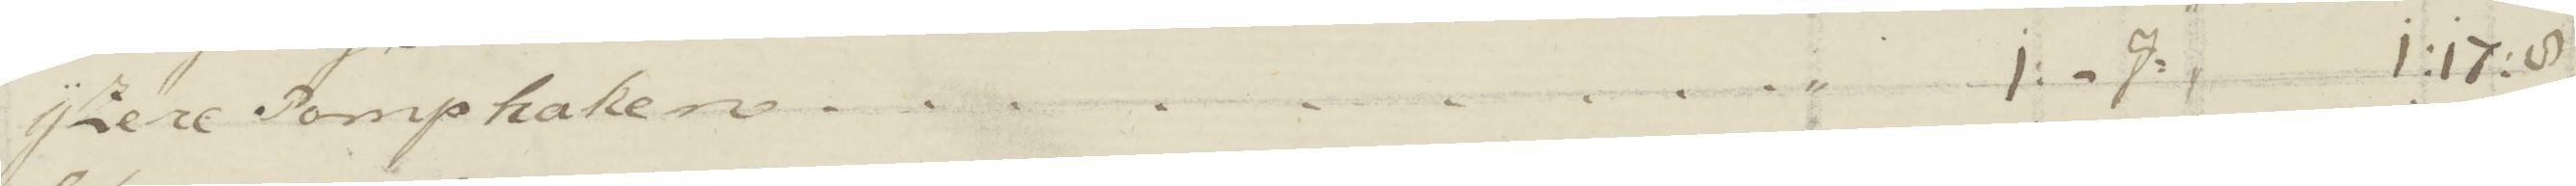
ijzere Pomphaken - - - - - - - - - „ 1: - ps „ 1:17: 8
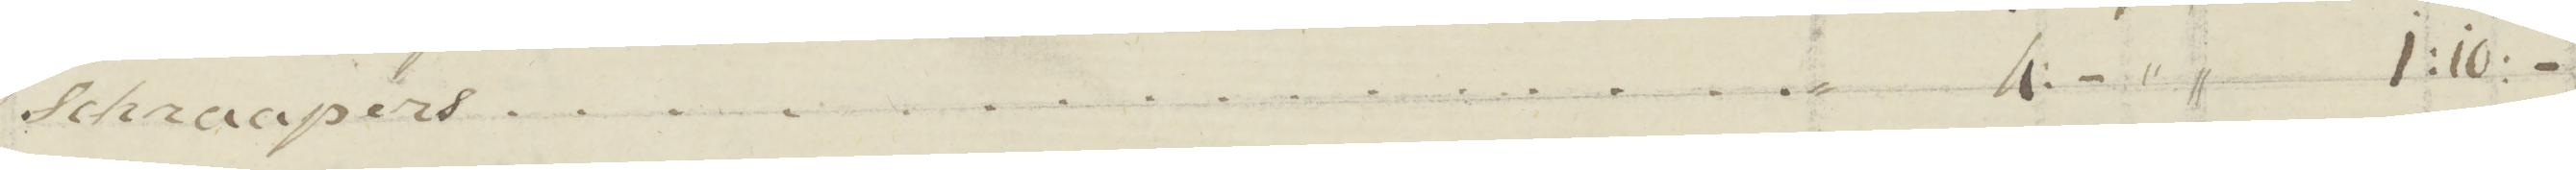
Schraapers - - - - - - - - - - - - - - - - „ 4: - „ „ 1:10: -
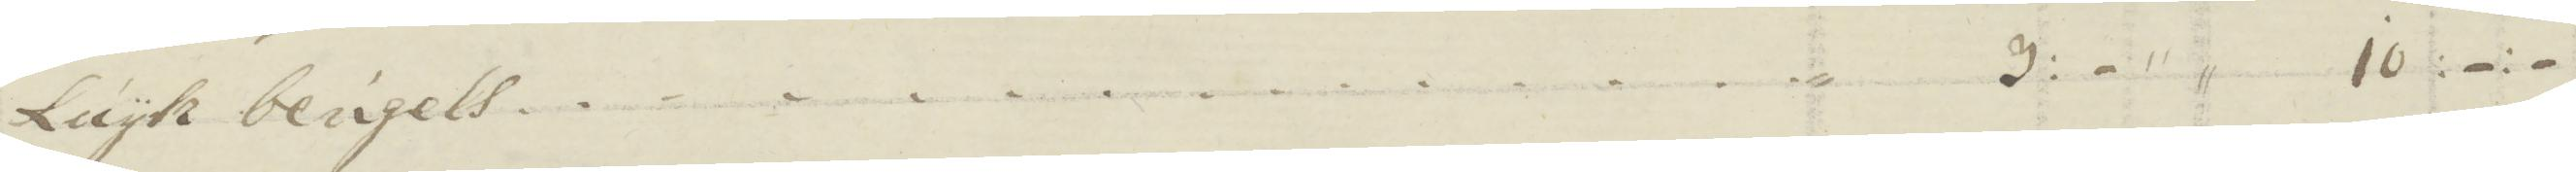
Luijk beugels - - - - - - - - - - - - - - - „ 3: - „ „ 10: -: -
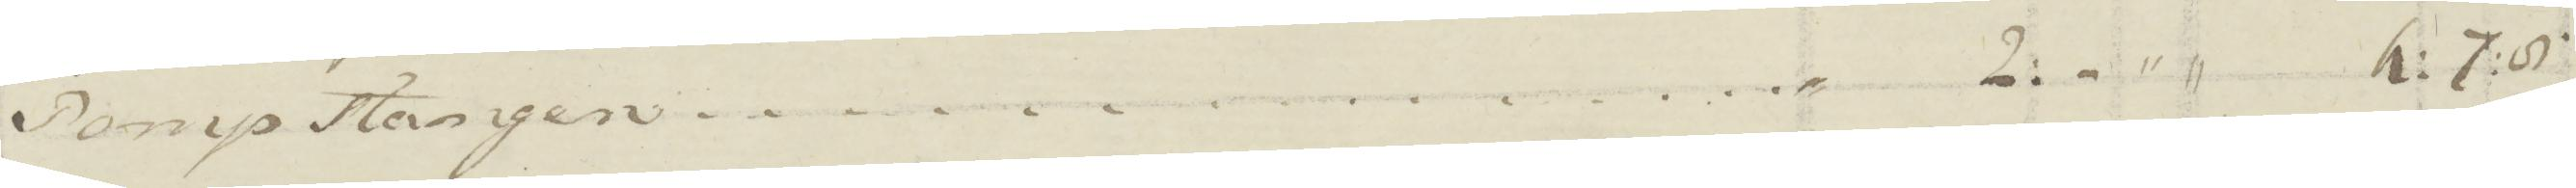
Pomp stangen - - - - - - - - - - - - - - - „ 2: - „ „ 4: 7:8
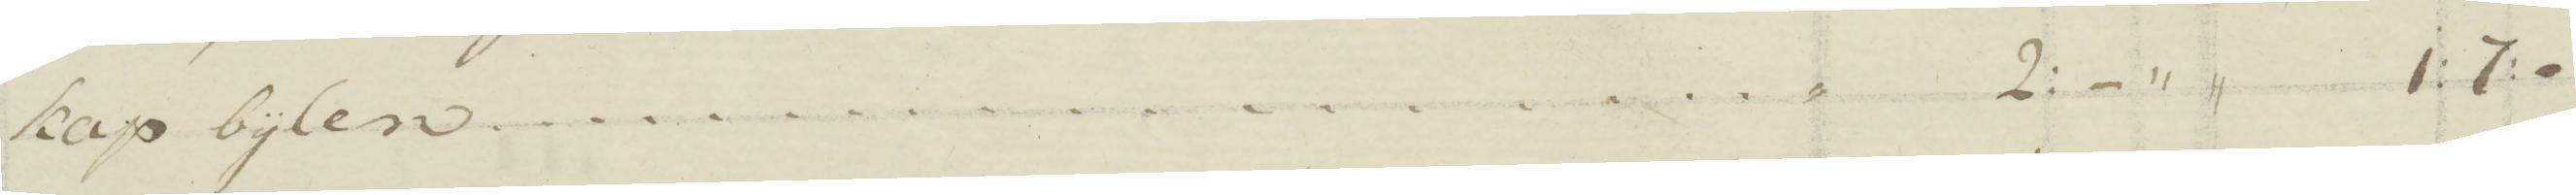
kap bijlen - - - - - - - - - - - - - - - - - - „ 2: - „ „ 1: 7: -
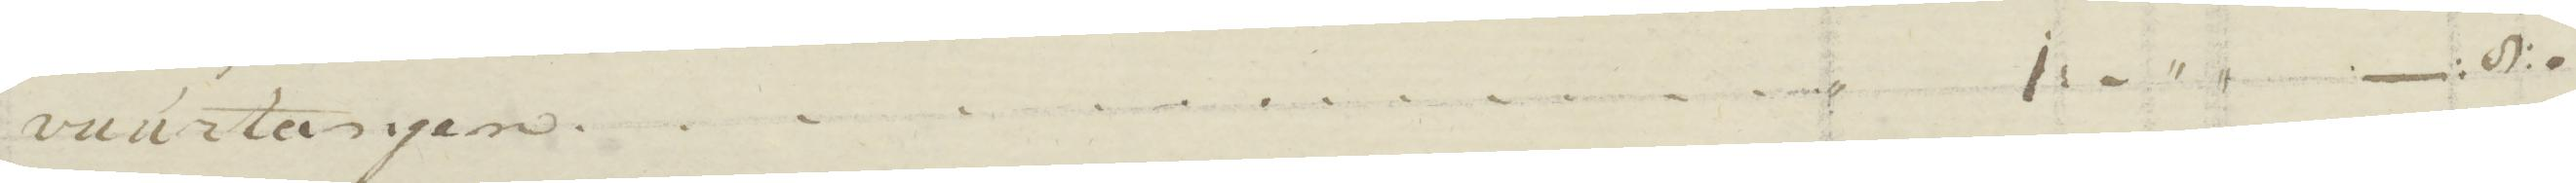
vuurtangen - - - - - - - - - - - - - „ 1: - „ „ —:8: -
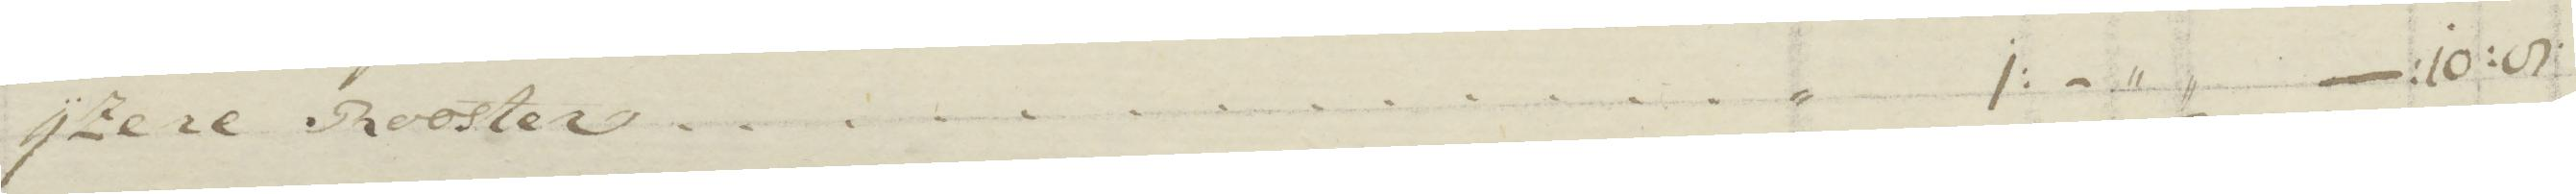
ijzere Rooster - - - - - - - - - - - - - „ 1: - „ „ —:10:8:
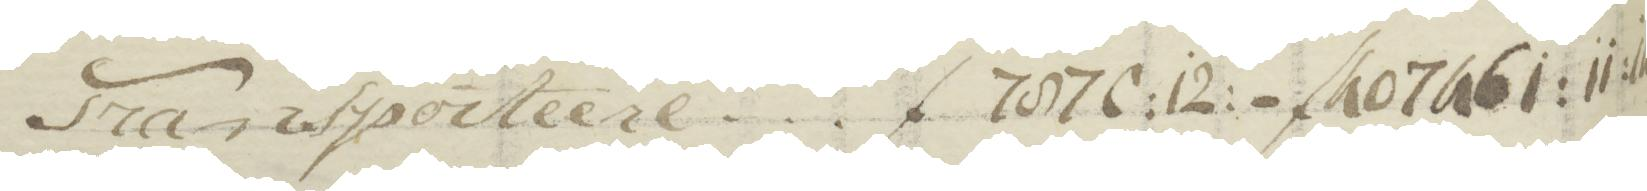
Transporteere - - - ƒ 7875:12:— ƒ407461: 11:1
